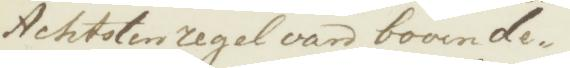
Achtsten regel van boven de„
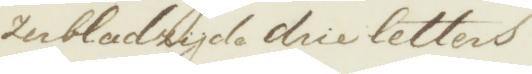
zer bladzijde drie letters
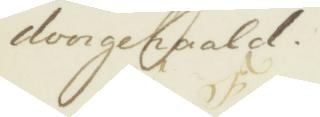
doorgehaald.
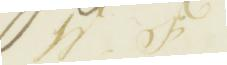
W F
